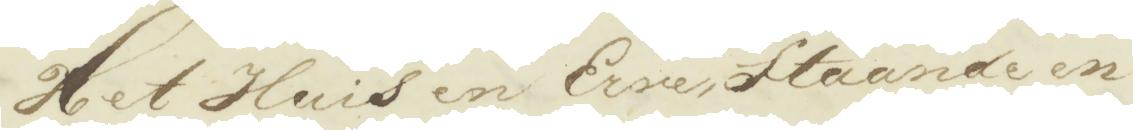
Het Huis en Erve, staande en
